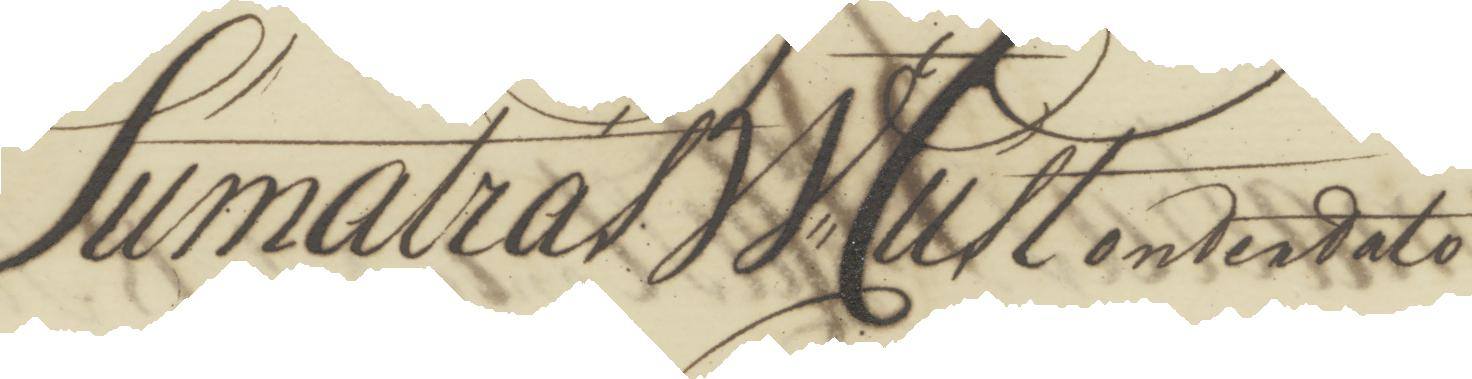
Sumatra's: W„t Cust onder dato
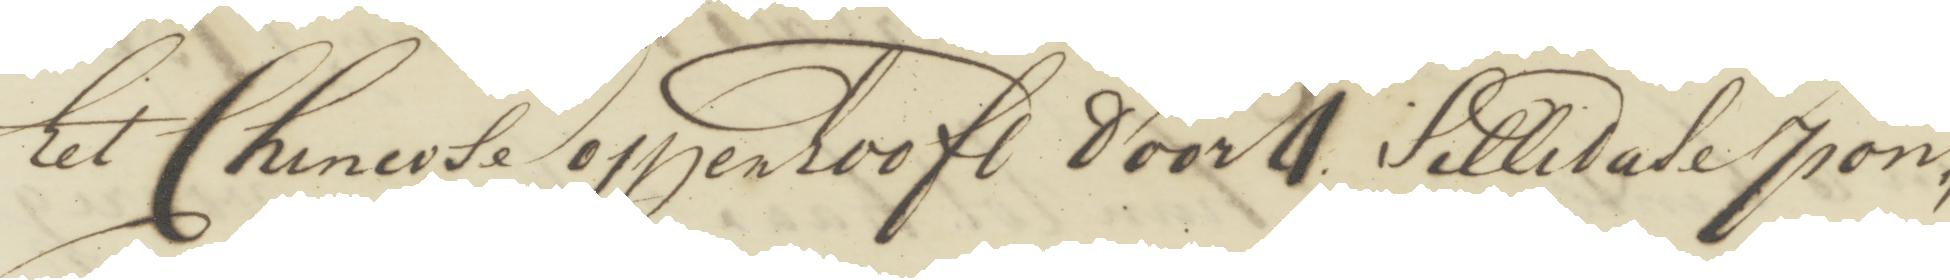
het Chineese opperhoofd door 4 sillidase pon
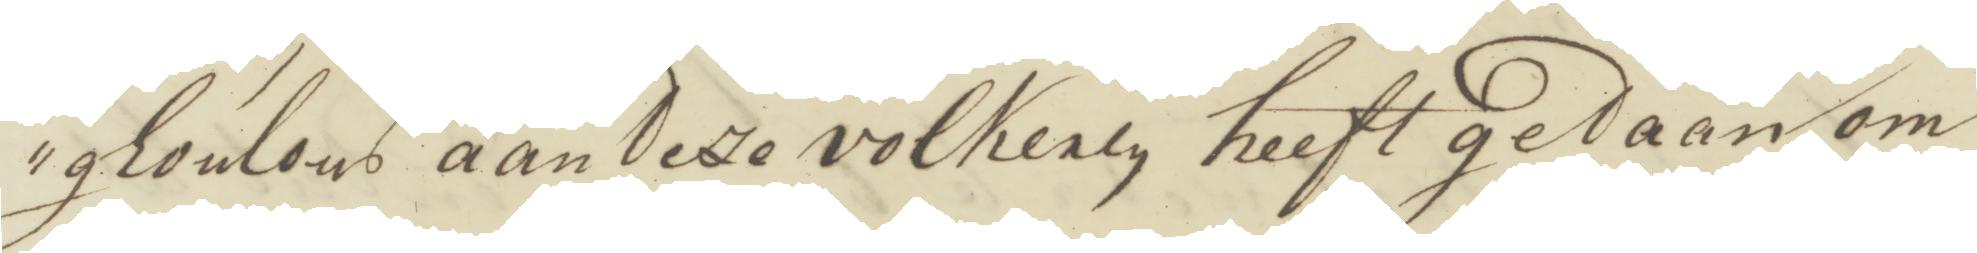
„ghoulous aan deze volkeren heeft gedaan, om
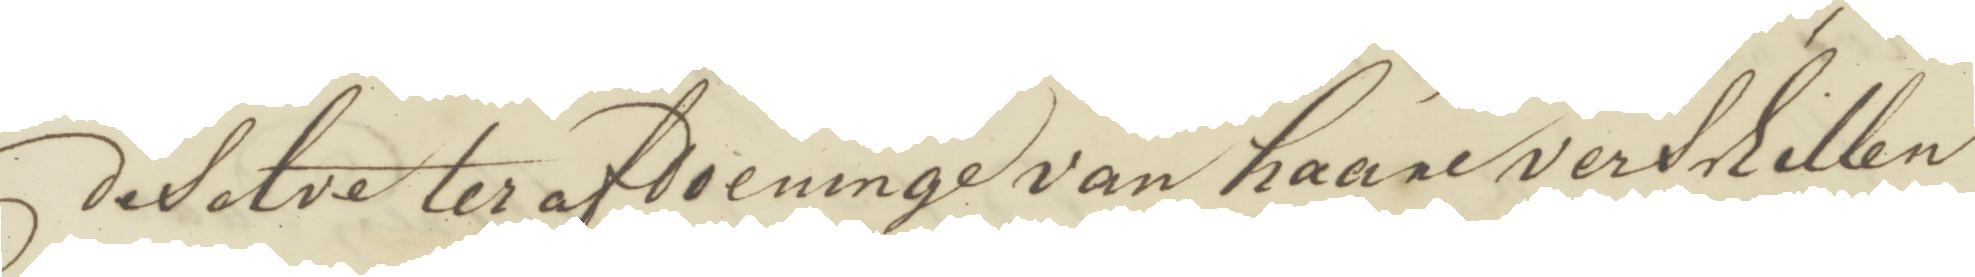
deselve ter afdoeninge van haare verschillen
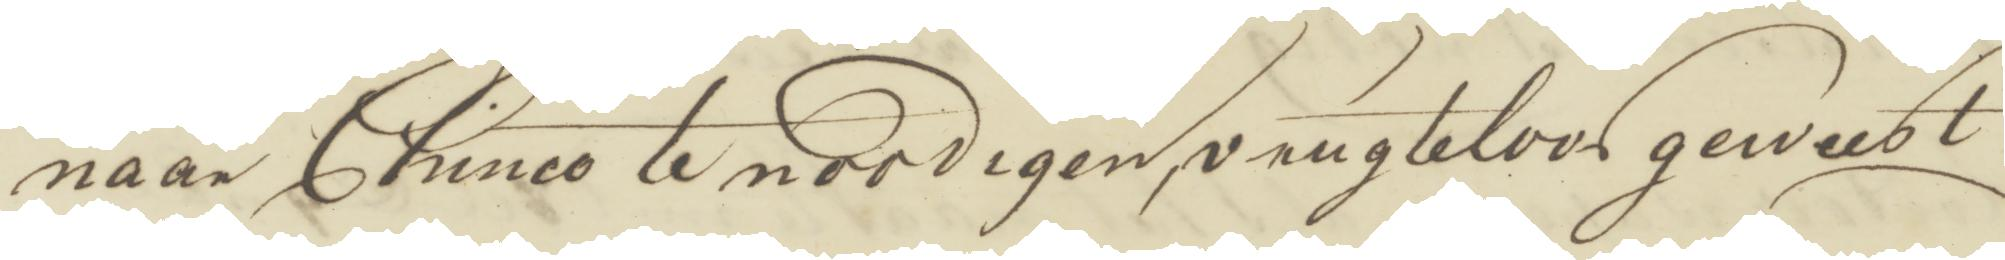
naar Chinco te noodigen, vrugteloos geweest
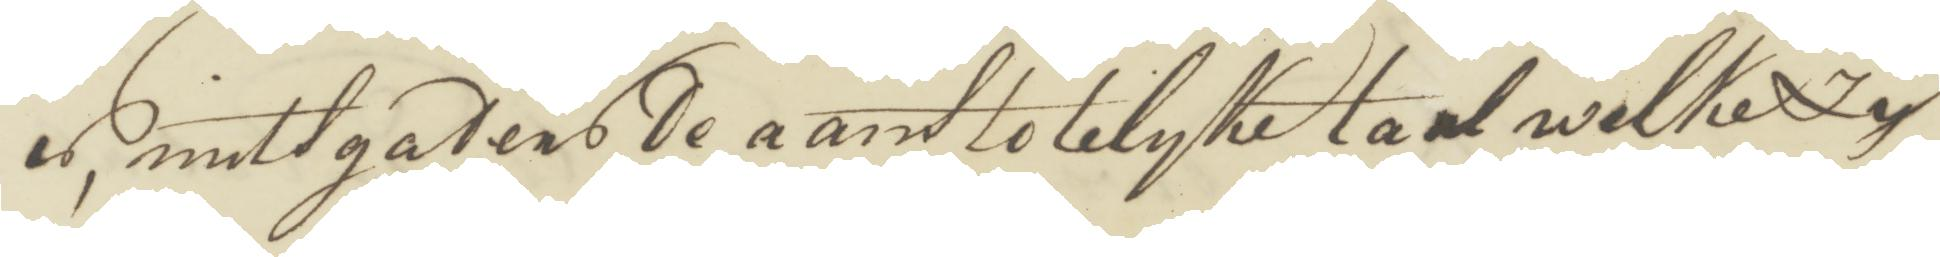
is, mitsgaders de aanstotelijke taal welke zij
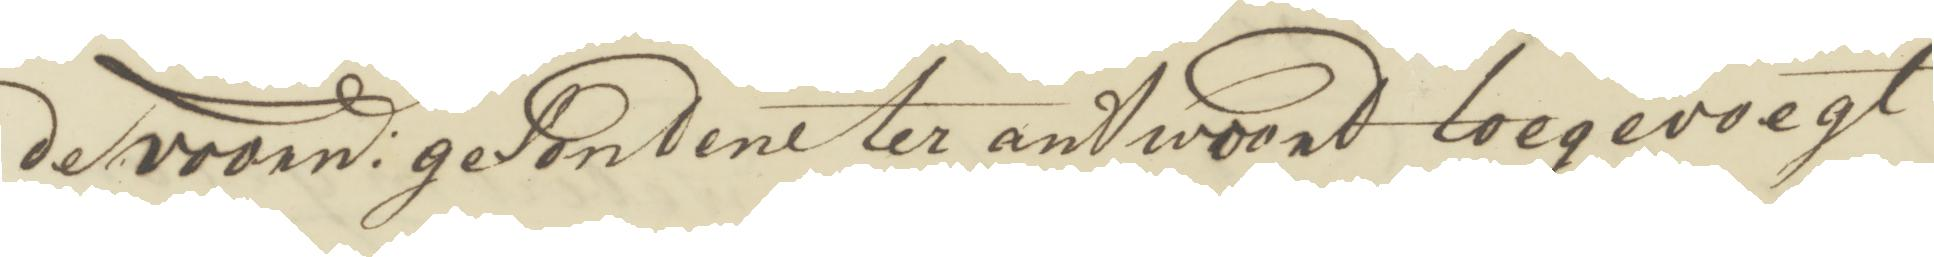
de voorn: gesondene ter antwoord toegevoegt
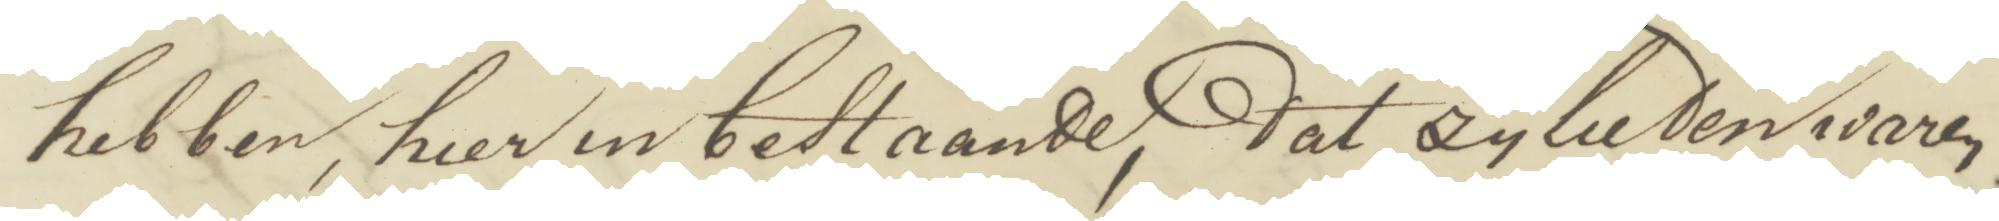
hebben, hier in bestaande, dat zij lieden waren
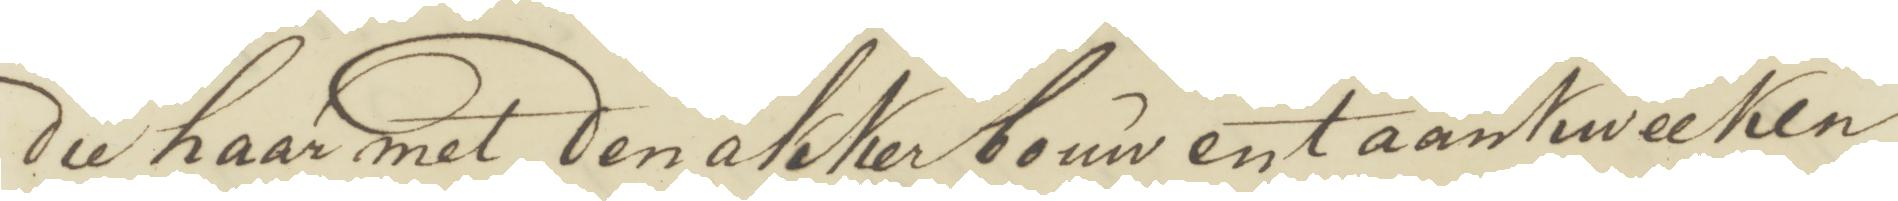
die haar met den akker bouw en’t aankweeken
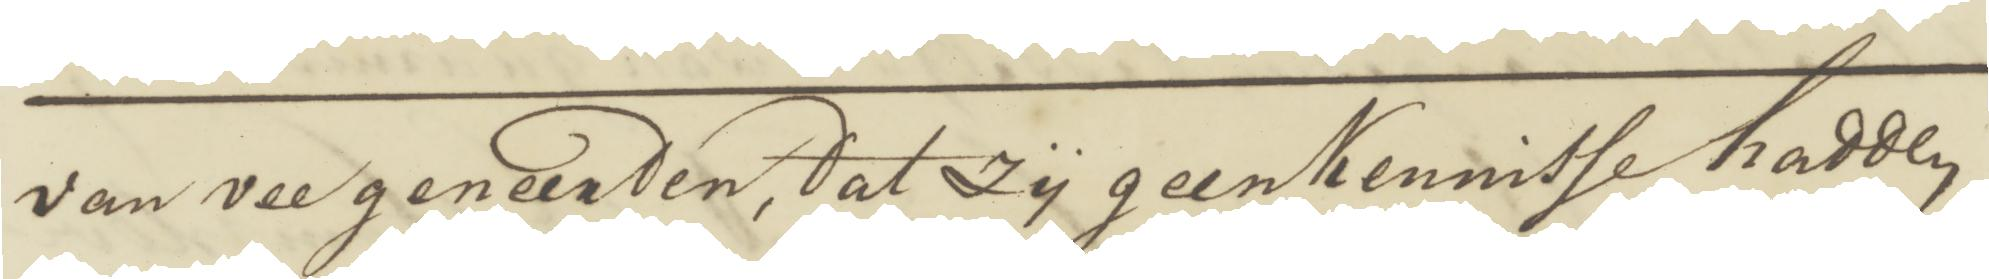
van vee geneerden, dat zij geen kennise hadden
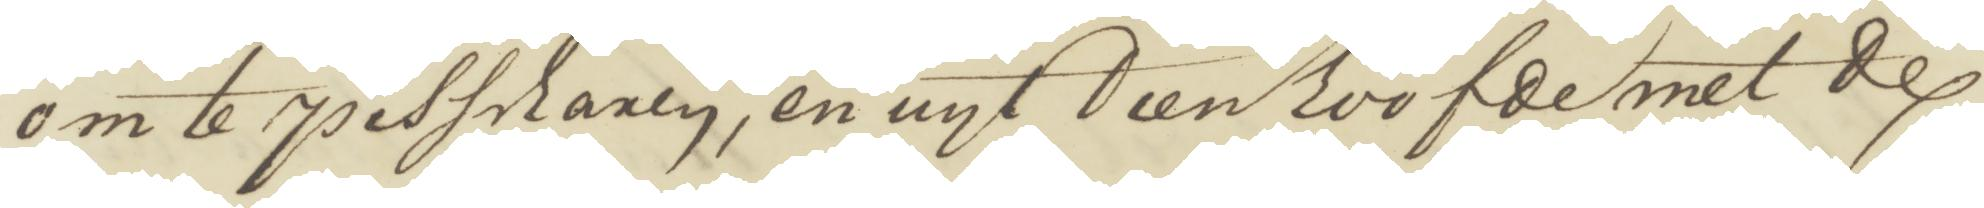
om te pisscharen, en uijt dien hoofde met de
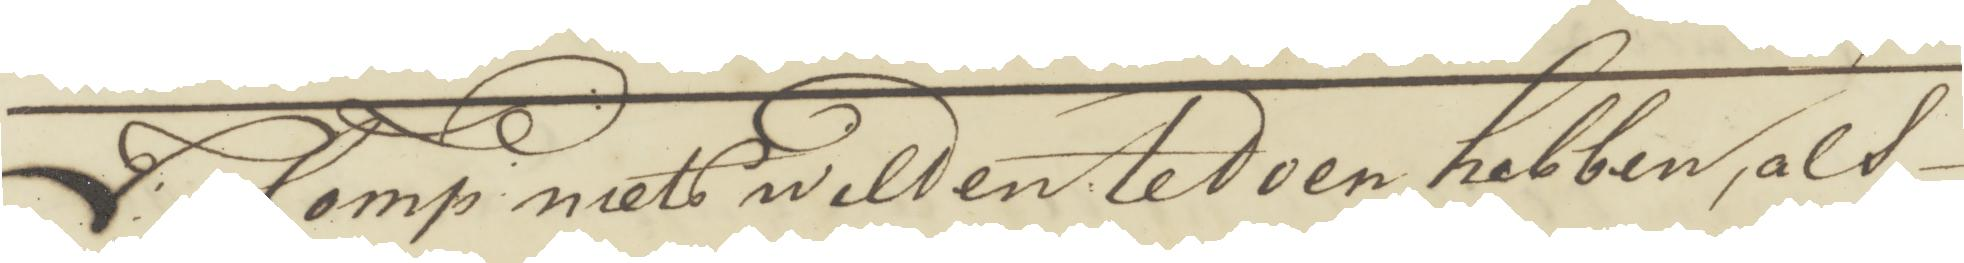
V: Comp: niet wilden te doen hebben, als_
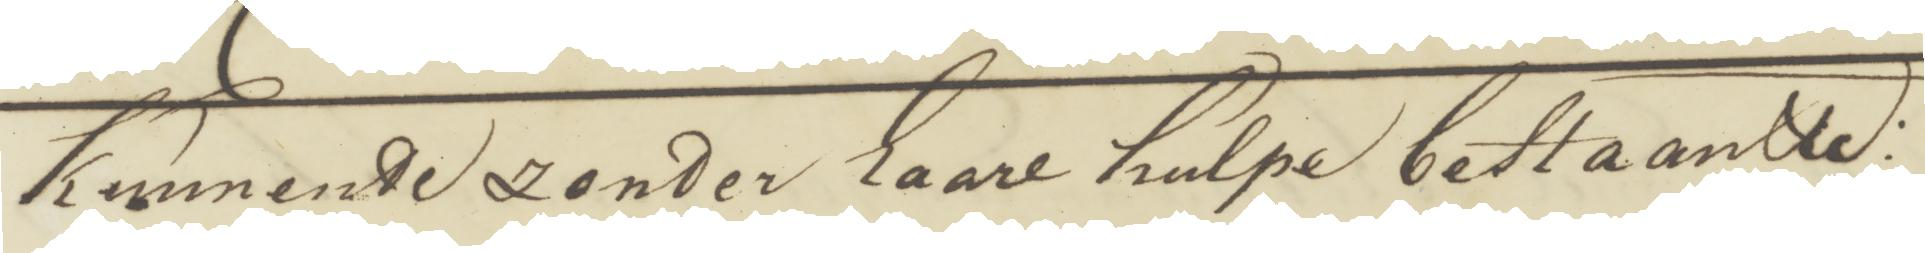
kunnende zonder haar hulpe bestaan etc:
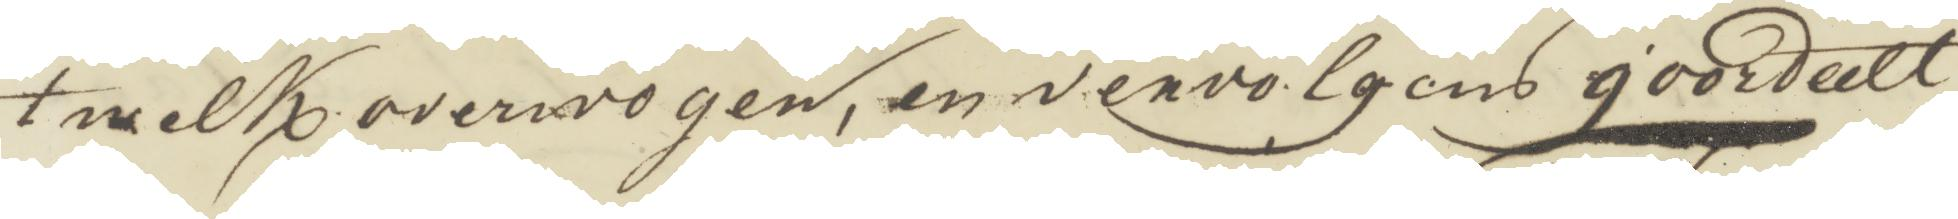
t welk overwogen, en vervolgens g'oordeelt
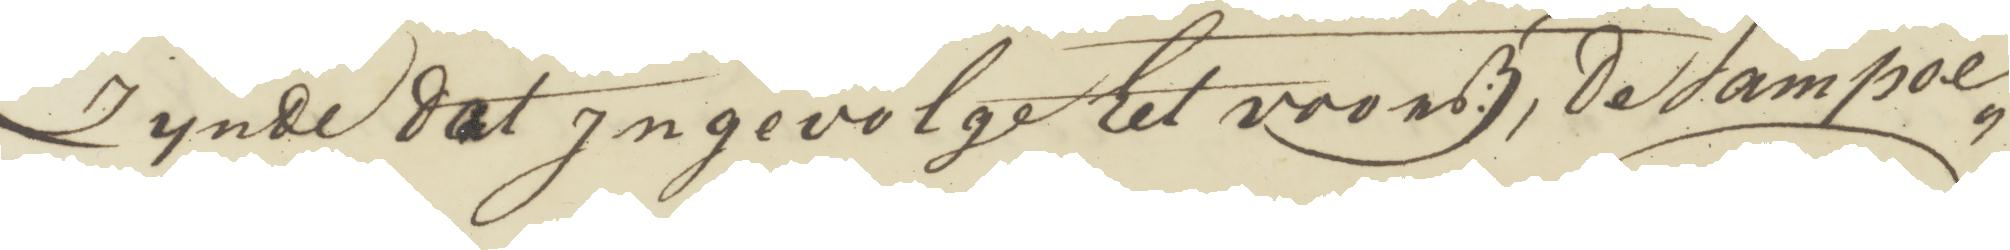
zijnde dat jngevolge het voors: de Iampoe„
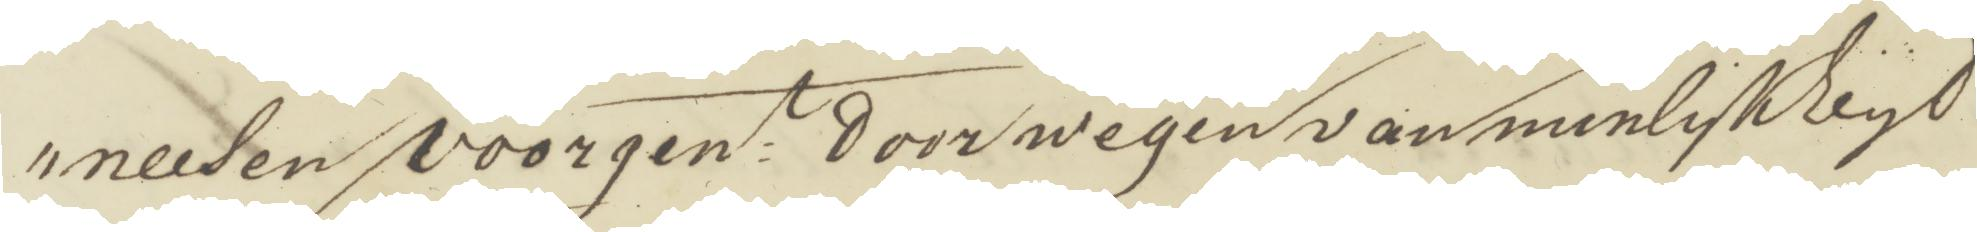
„neesen voorgen:t door wegen van minlijkheijd
